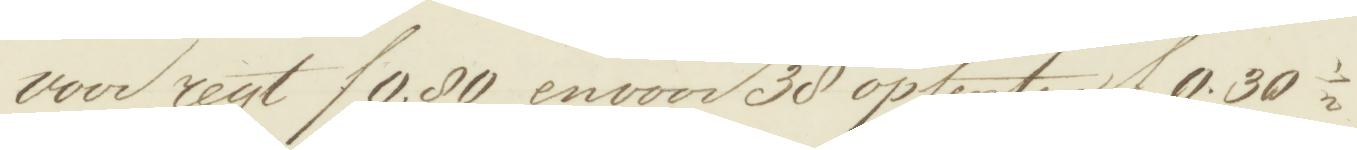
voor regt ƒ0.80 envoor 38 opcenten ƒ 0.30 ½
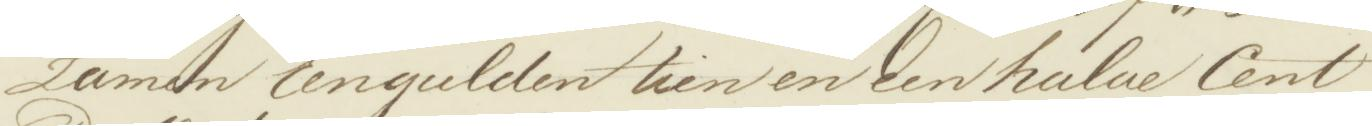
zamen Eengulden tien en Een halve Cent
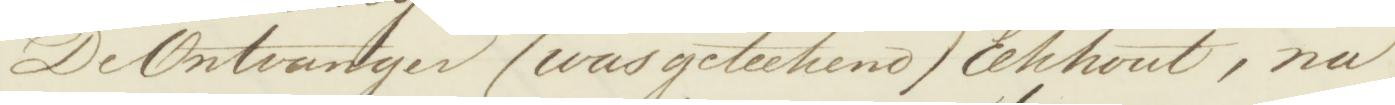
De Ontvanger (was geteekend) Eekhout, na
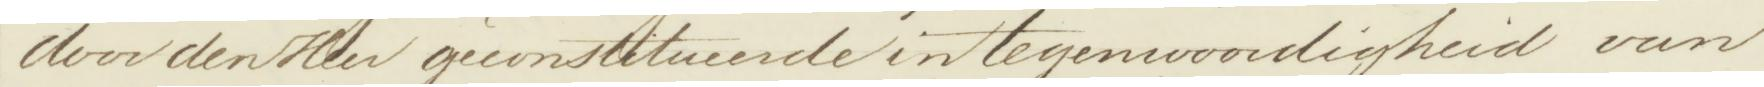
door denHeer geconstitueerde in tegenwoordigheid van
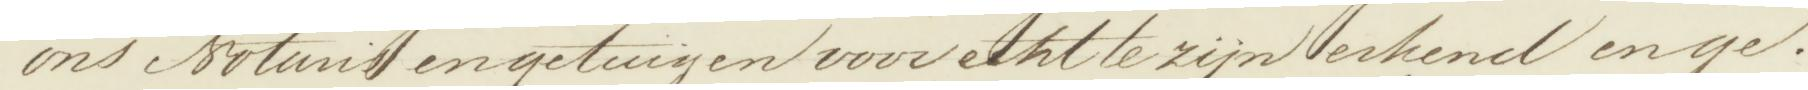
ons Notaris en getuigen voor echt te zijn erkend en ge.
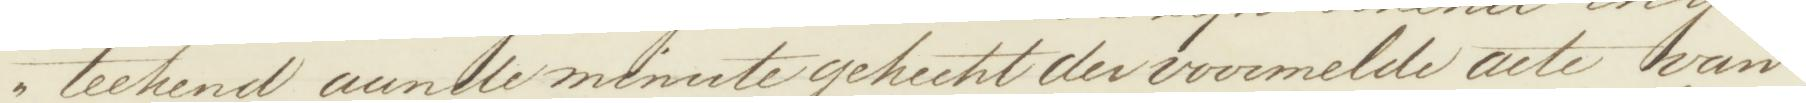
„ teekend aande minute gehecht der voormelde acte van
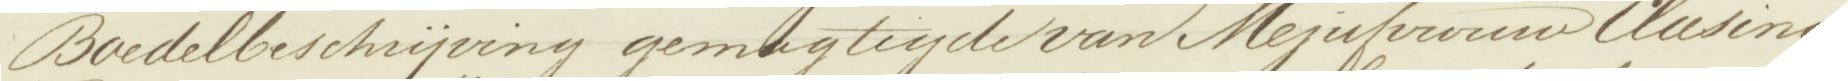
Boedelbeschrijving gemagtigde van Mejufvrouw Clasina
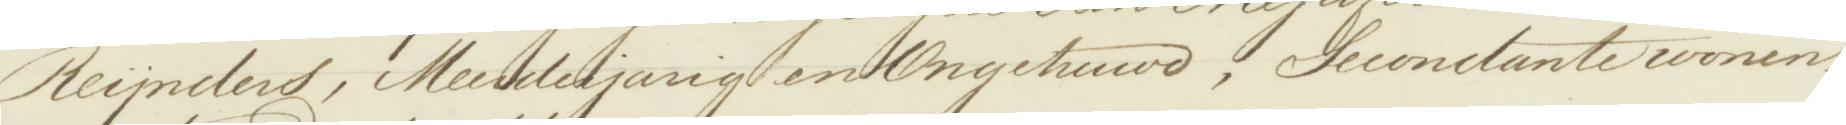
Reijnders, Meerderjarig en Ongehuwd, Secondante wonen,
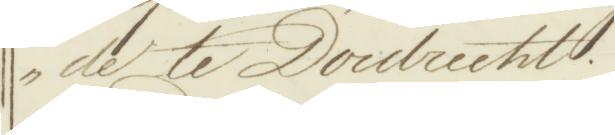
„de te Dordrecht.
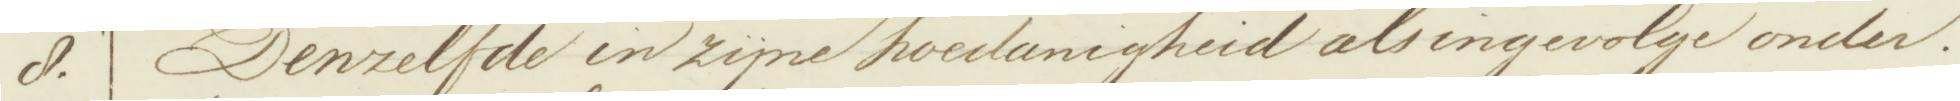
8. Denzelfde in zijne hoedanigheid als ingevolge onder
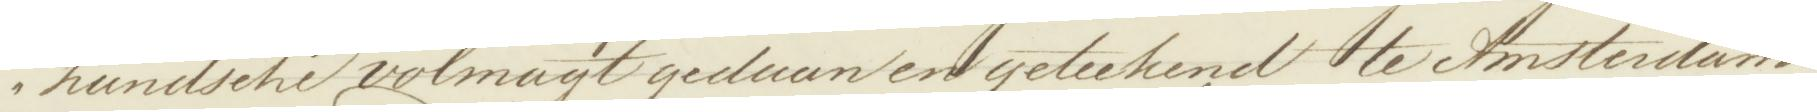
„handsche volmagt gedaan en geteekend te Amsterdam
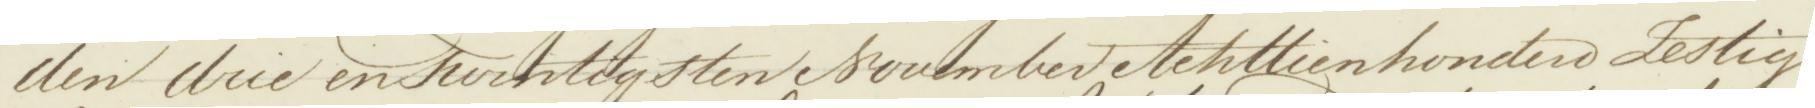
den drie en Twintigsten November Achttienhonderd Zestig
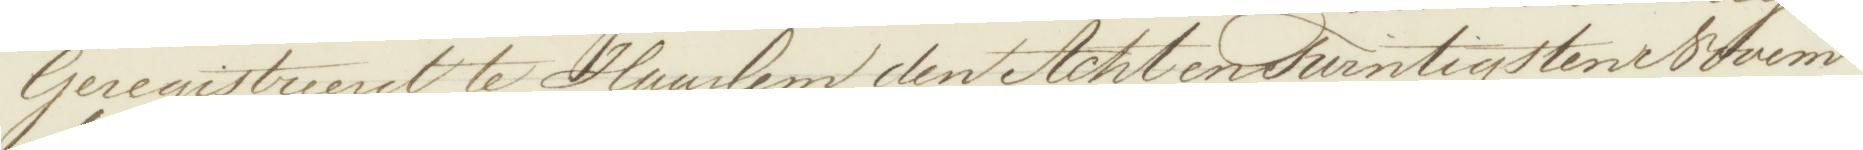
Geregistreerd te Haarlem den Acht en Twintigsten Novem
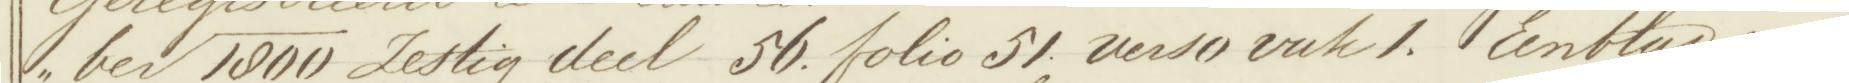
„ber 1800 Zestig deel 56. folio 51. verso vak 1. Een blad een
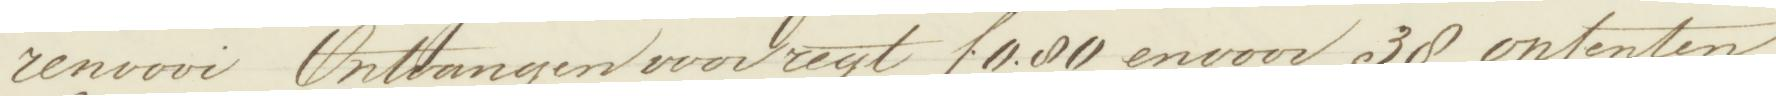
renvooi Ontvangen voor regt ƒ0.80 envoor 38 opCenten
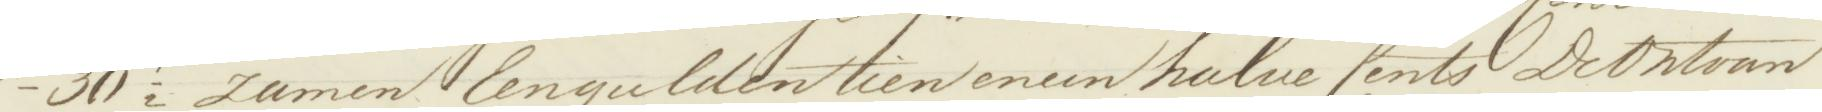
-30½ zamen Eengulden tien eneen halve cents DeOntvan
